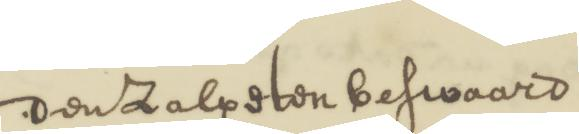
den zalpeter beswaard
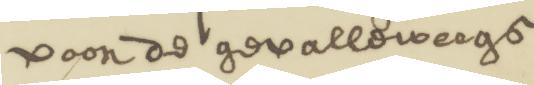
voor de gevalle weegs
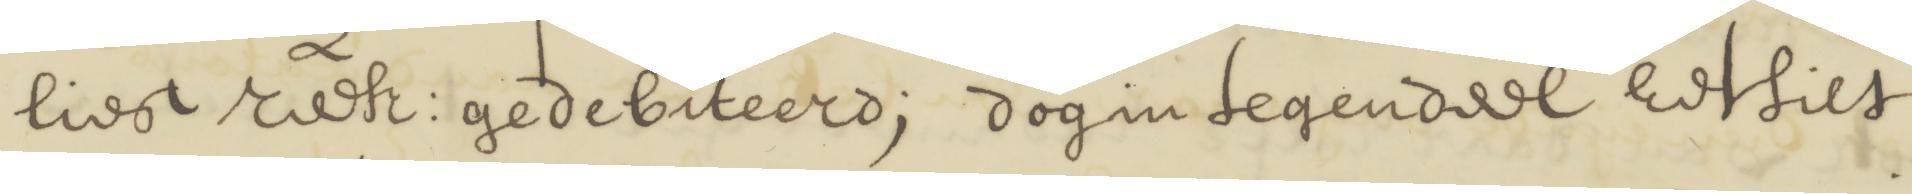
lies reek: gedebiteerd; dog in tegendeel het siet
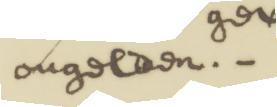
ongelden. –
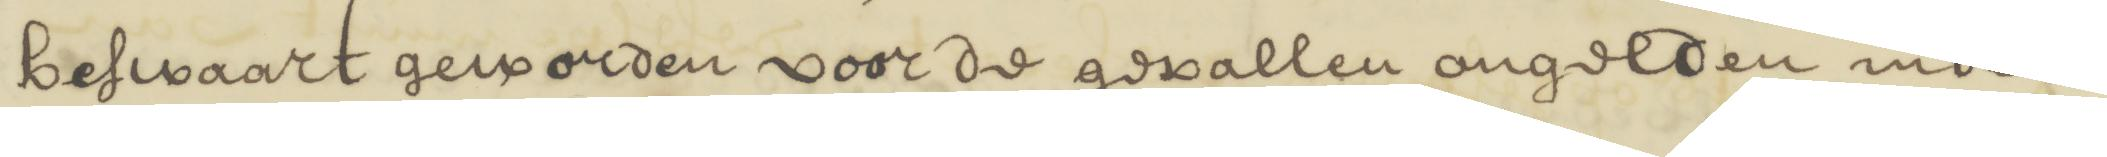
beswaart geworden voor de gevallen ongelden in den
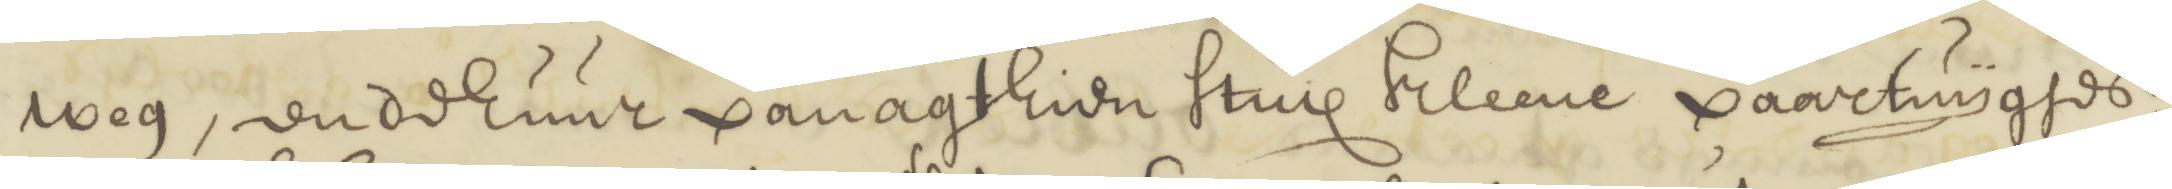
weg, en de huur van agthien stux kleene vaartuijgjes,
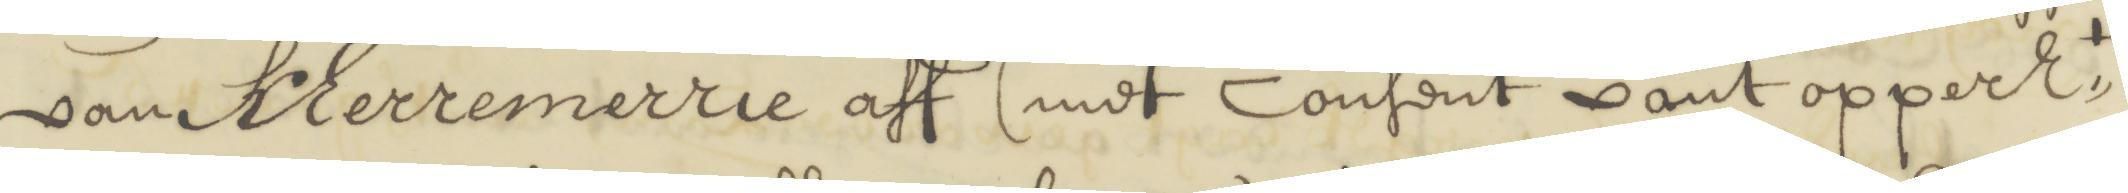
van Kherremerrie aff (met consent van't opperh„t
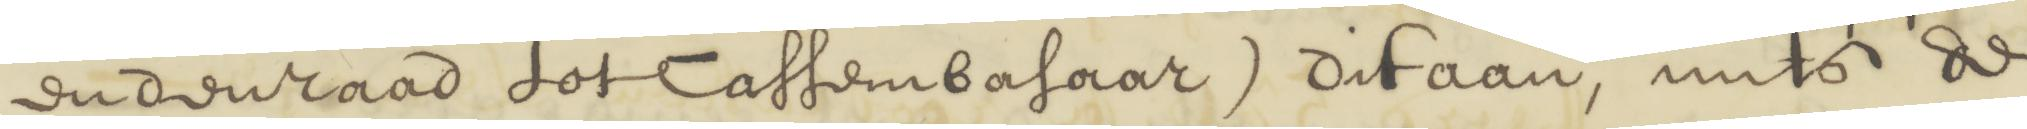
en den raad tot Cassembasaar) dit aan, mits de
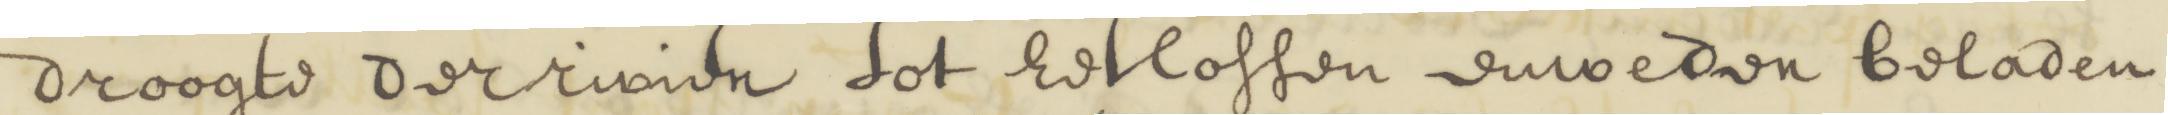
droogte der rivier tot het lossen enweder beladen
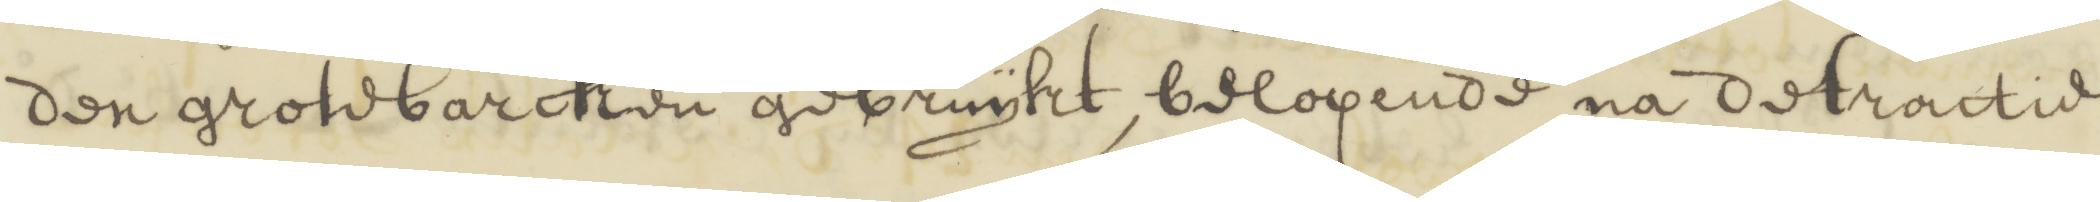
der grote barcken gebruijkt, belopende na detractie
